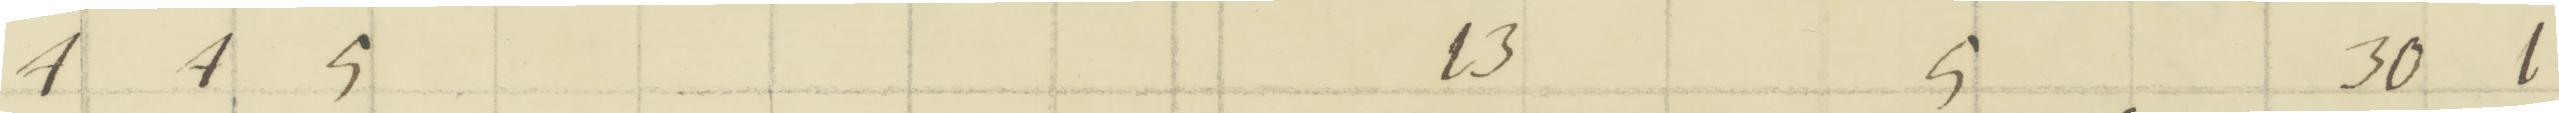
4 4 5 13 5 30 1
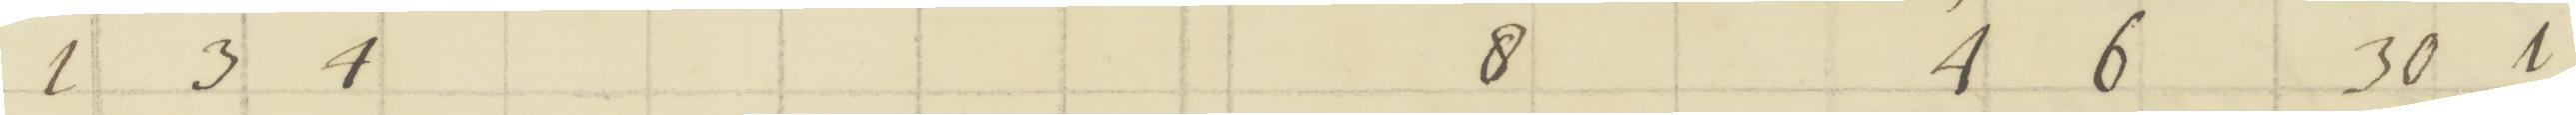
1 3 4 8 4 6 30 1
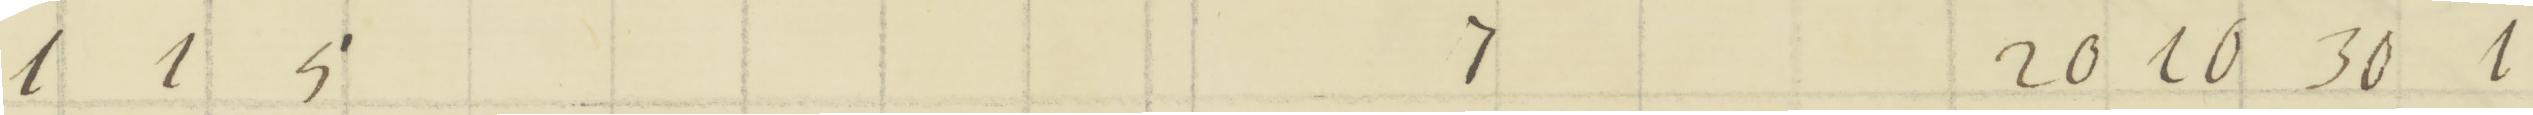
1 1 5 7 20 10 30 1
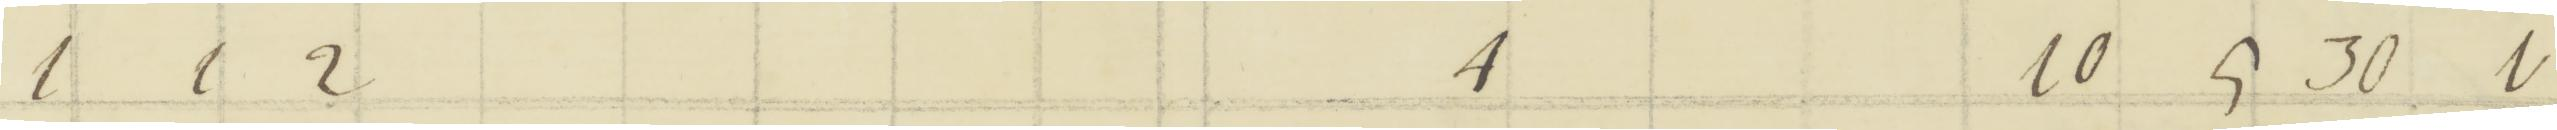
1 1 2 4 10 5 30 1
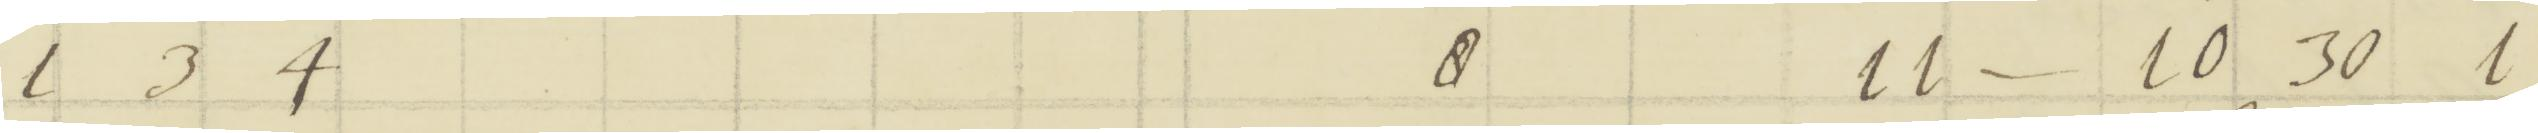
1 3 4 8 11 — 10 30 1
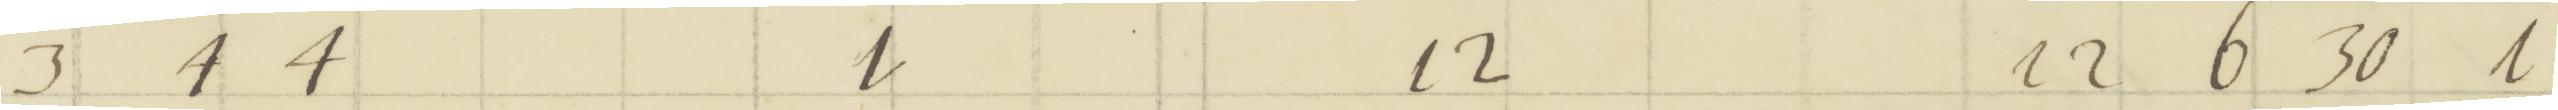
3 4 4 1 12 12 6 30 1
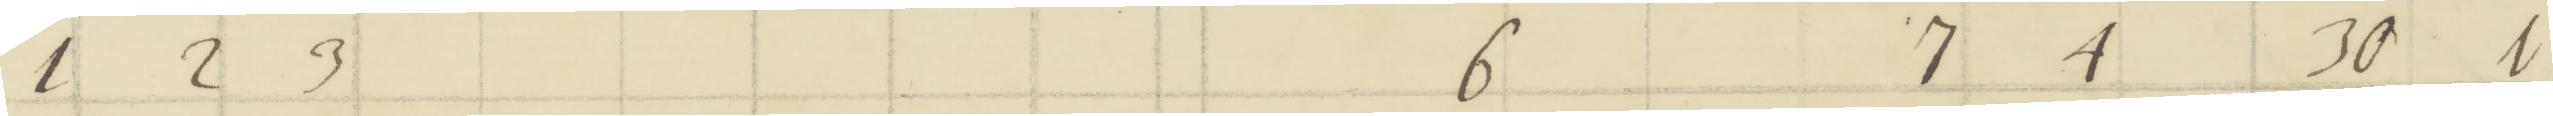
1 2 3 6 7 4 30 1
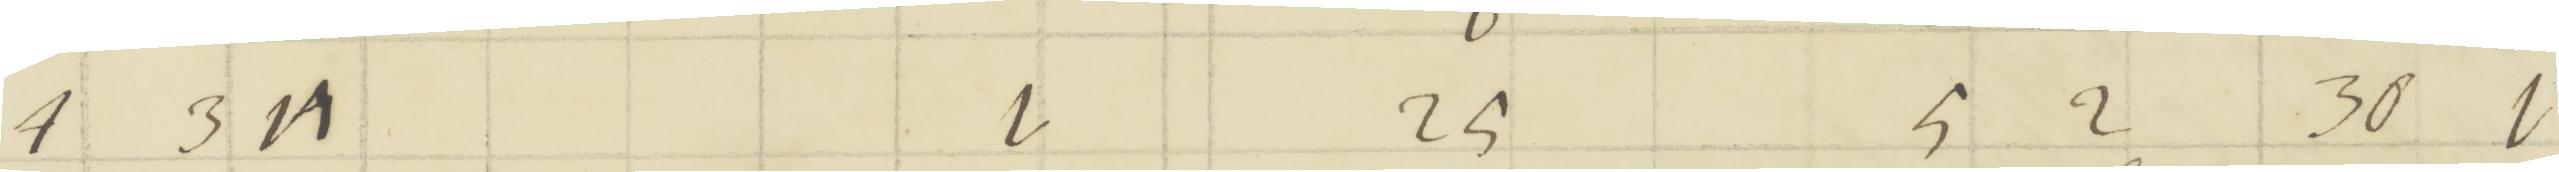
4 3 14 1 25 5 2 30 1
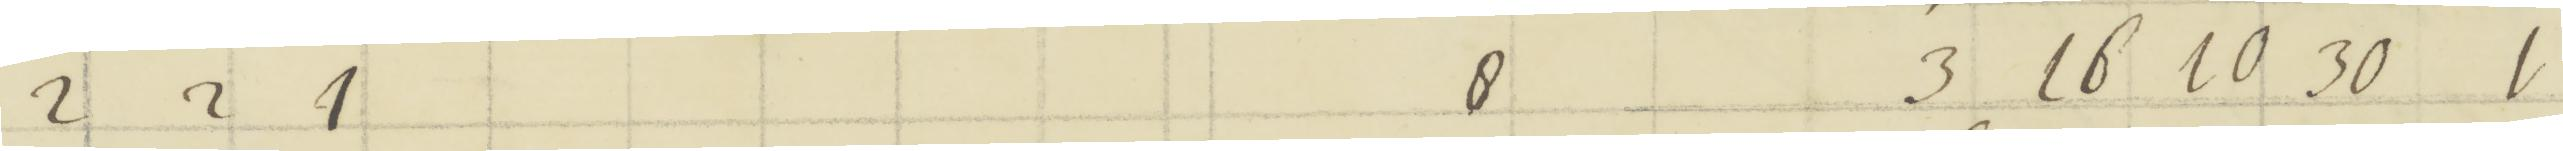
2 2 4 8 3 16 10 30 1
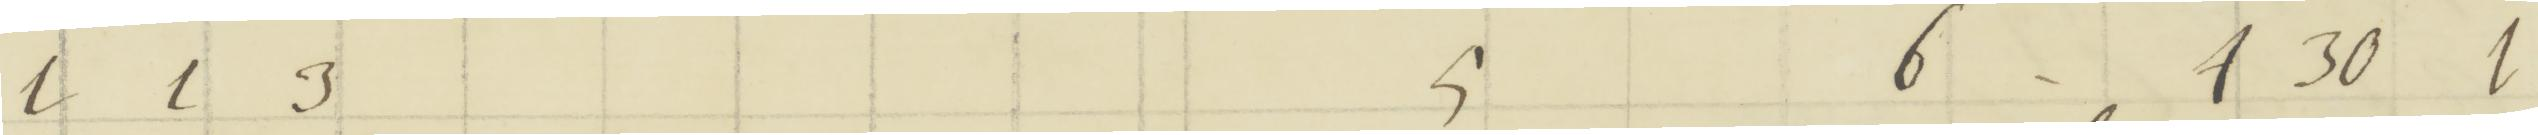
1 1 3 5 6 - 4 30 1
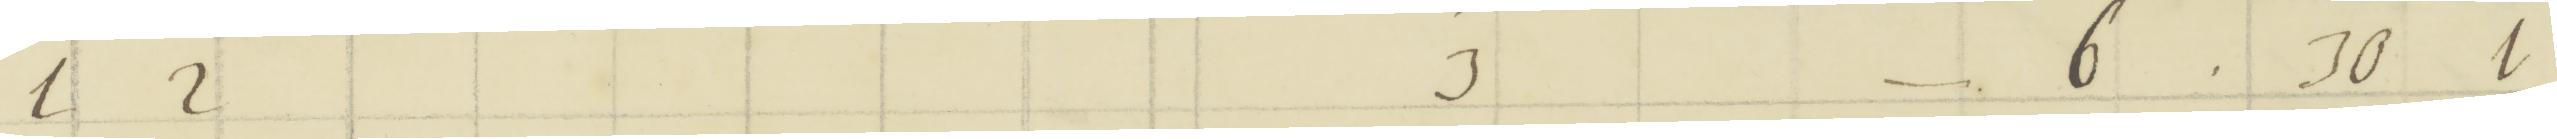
1 2 3 — 6 . 30 1
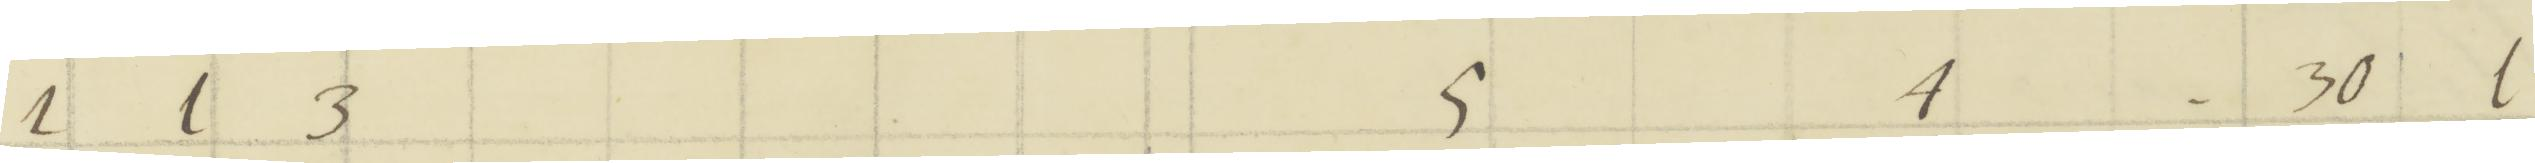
1 1 3 5 4 - 30 1
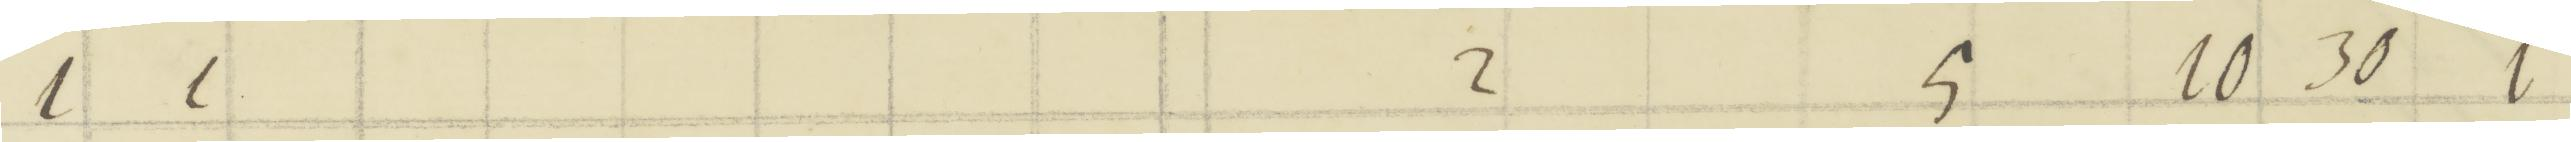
1 1 2 5 10 30 1
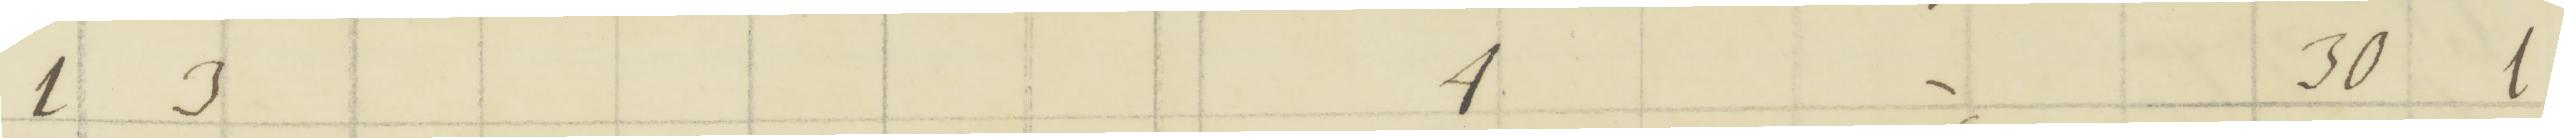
1 3 4 - 30 1
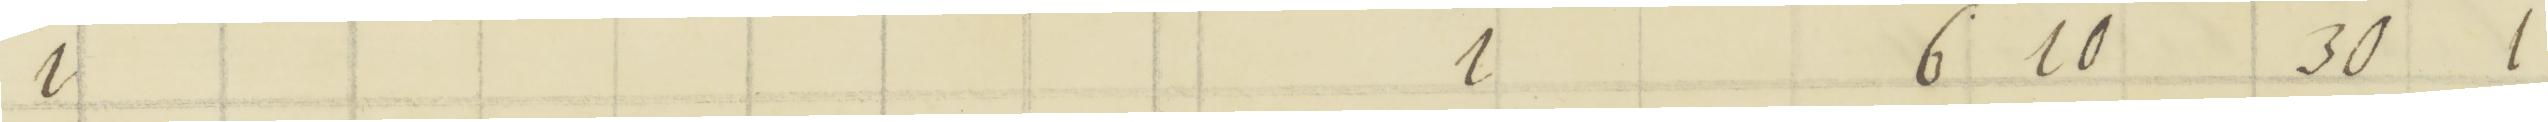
1 1 6 10 30 1
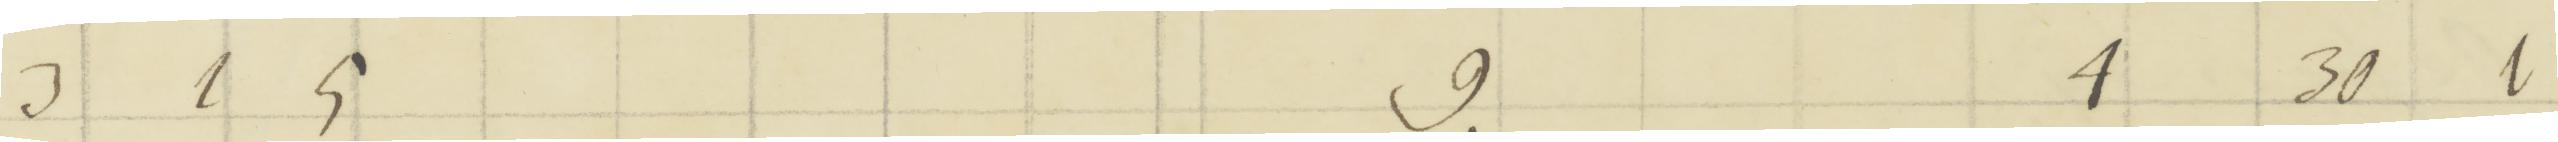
3 1 5 9 4 30 1
